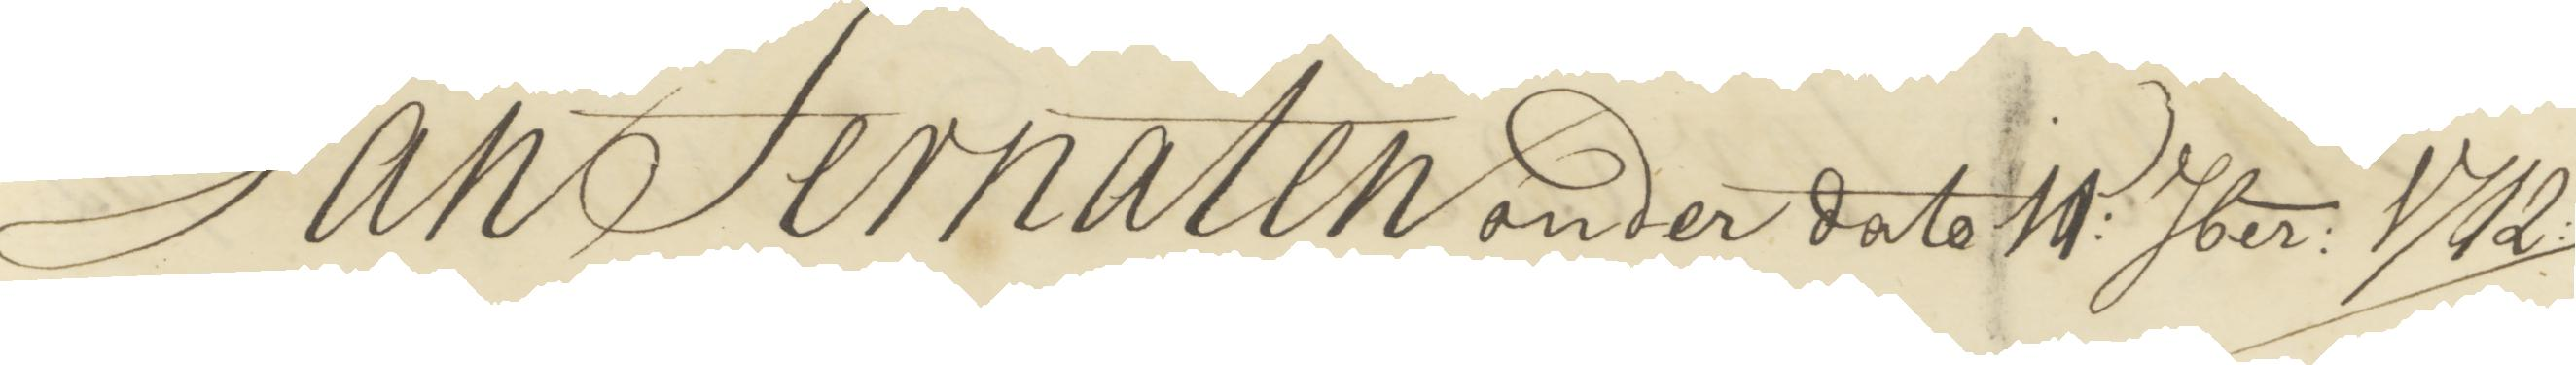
Van Ternaten onder dato 14:' 7ber: 1742
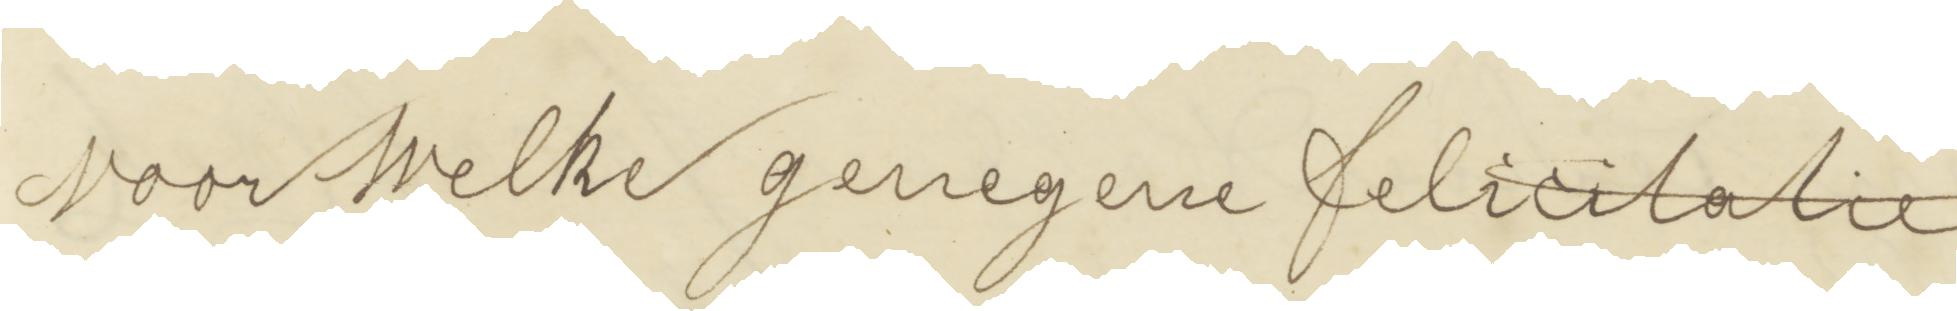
voor welke genegene felicitatie
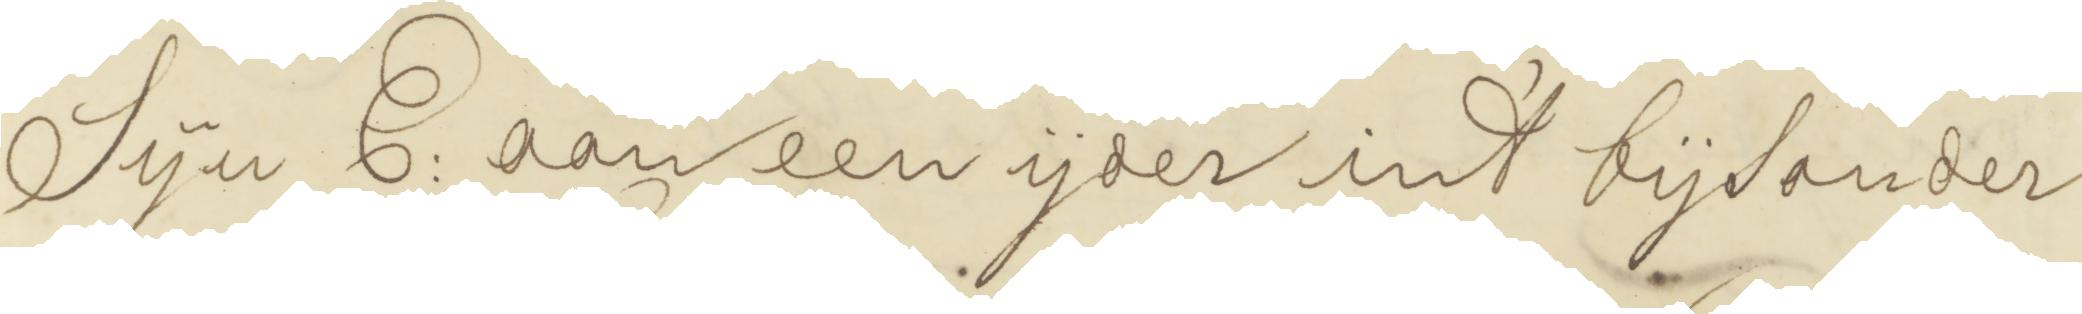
Sijn E: aan een ijder in’t bijsonder
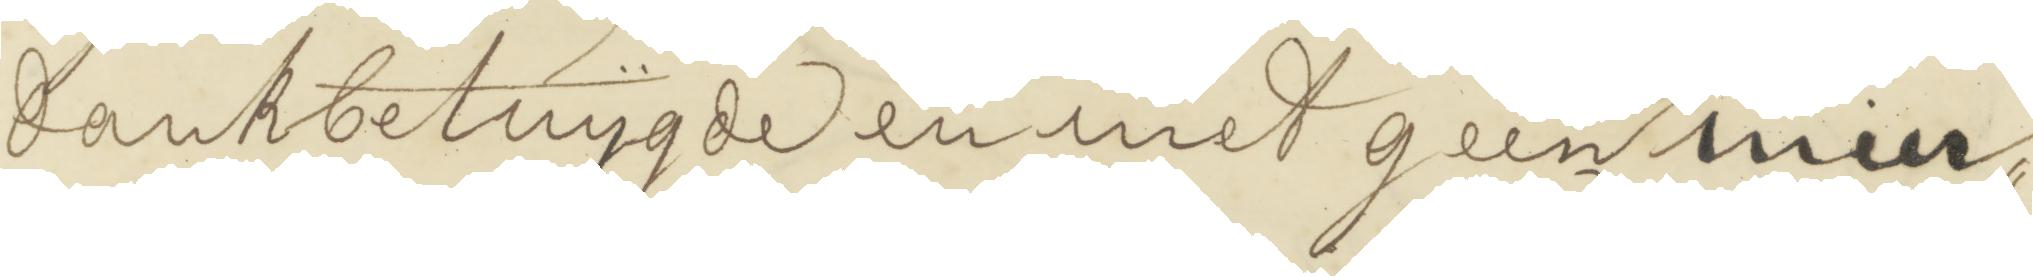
dank betuijgde en met geen min„
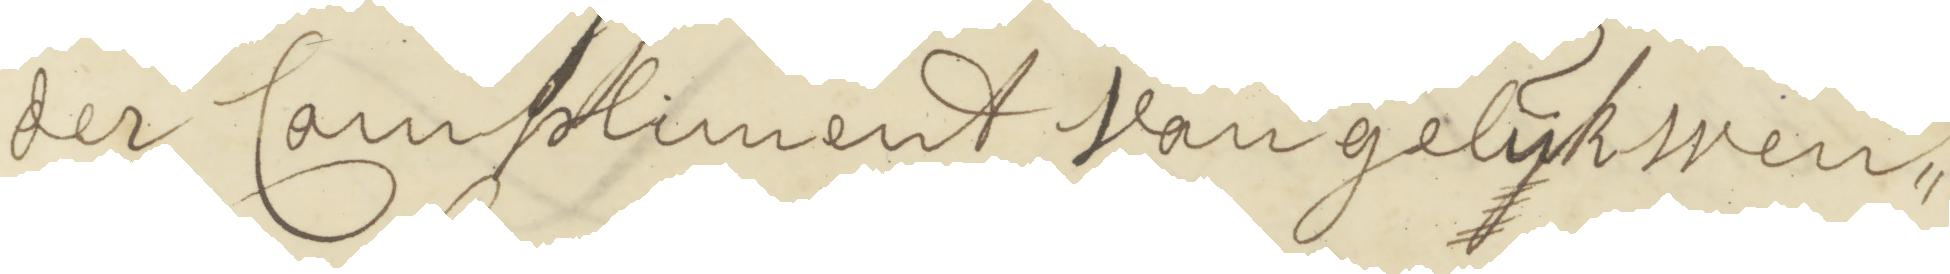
der Compliment van gelukwen„
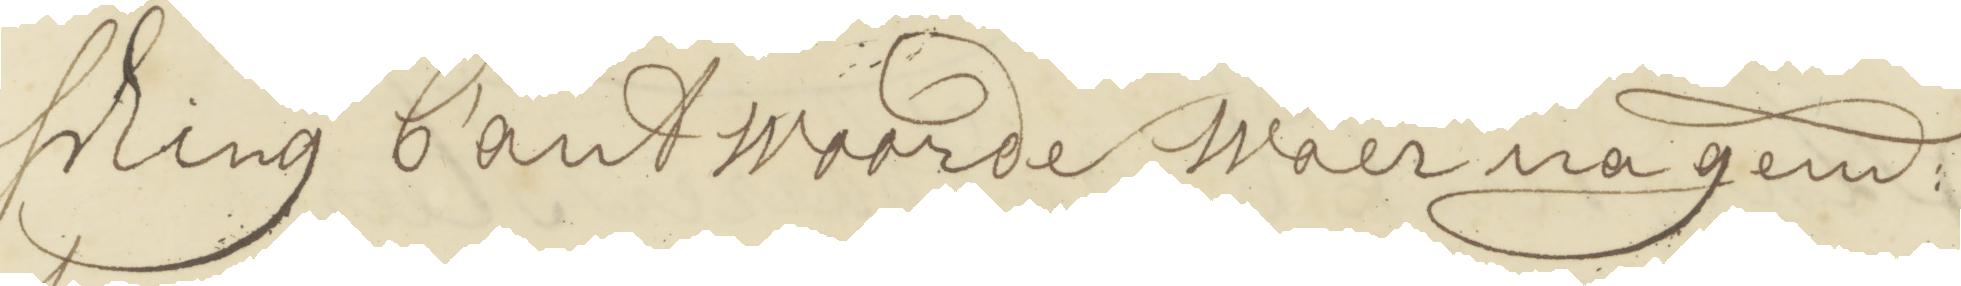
sching b'antwoorde waer na gem:
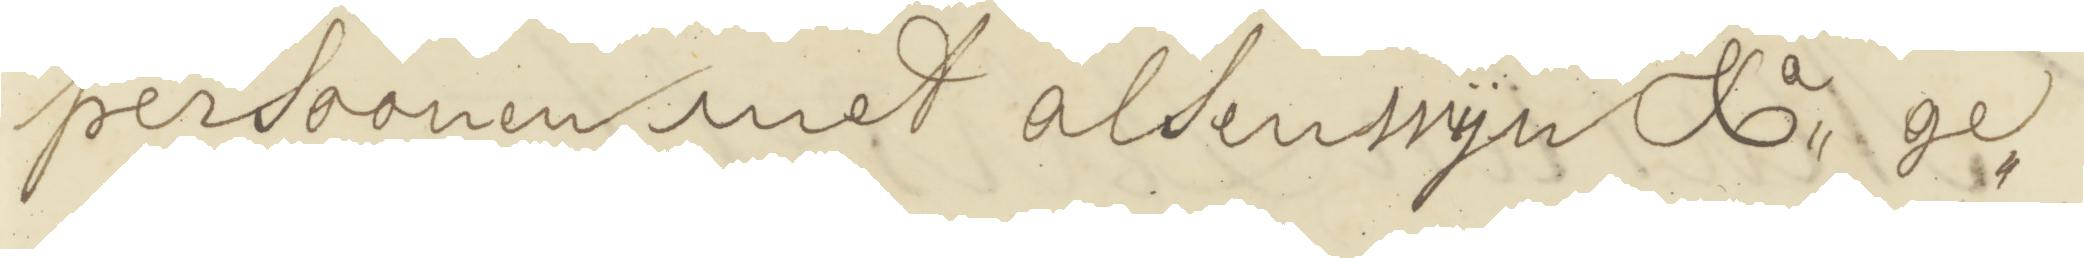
persoonen met alsen wijn &„a ge„
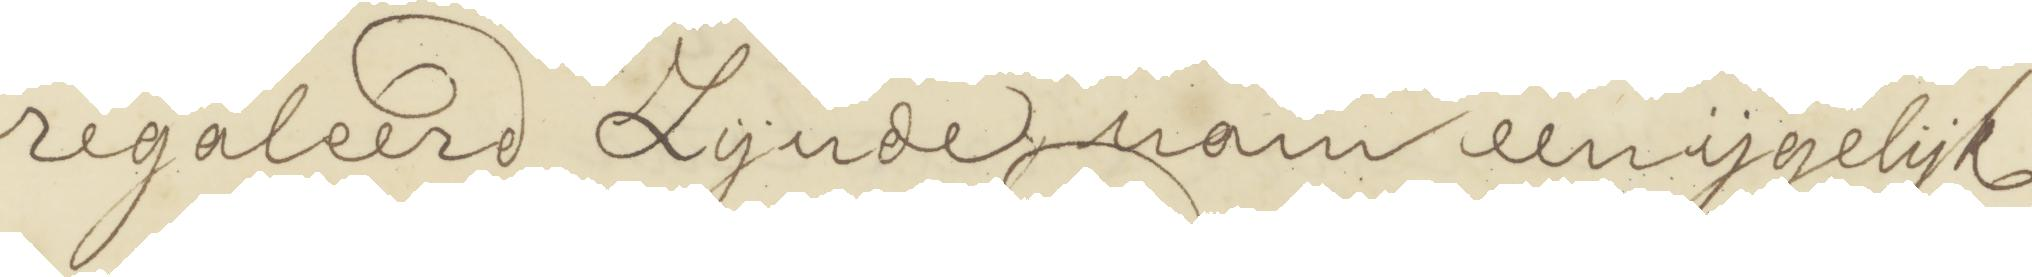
regaleerd zijnde nam een ijgelijk
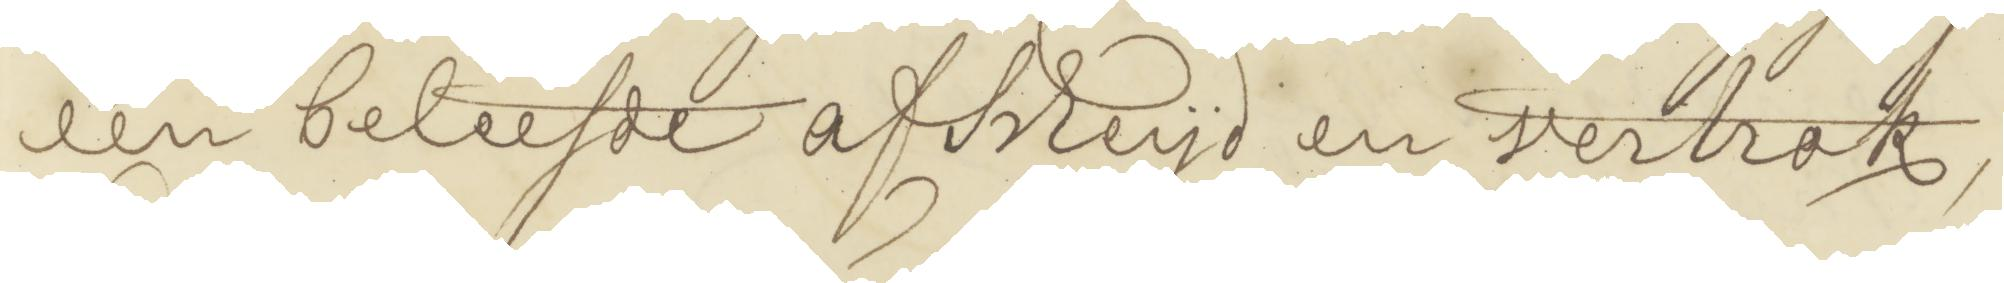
een beleefde afscheijd en vertrok,
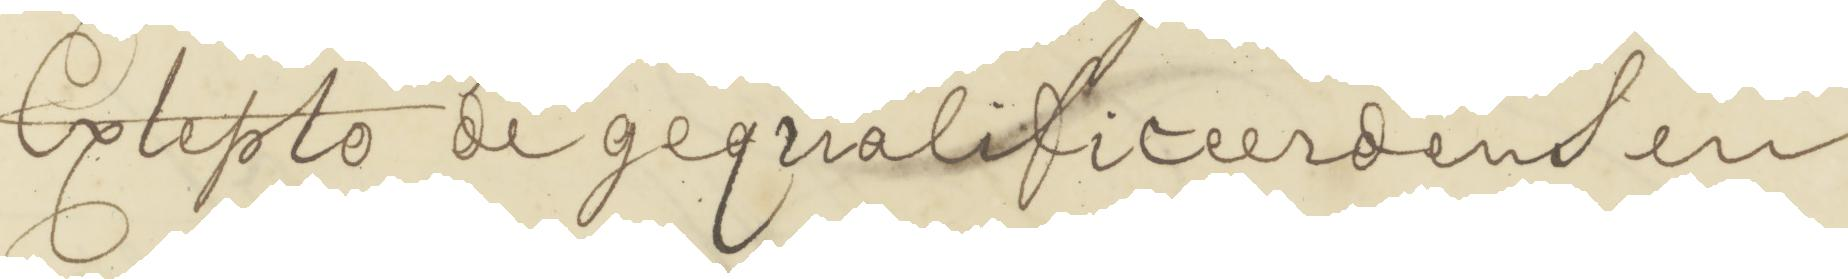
Extepto de gequalificeerdens en
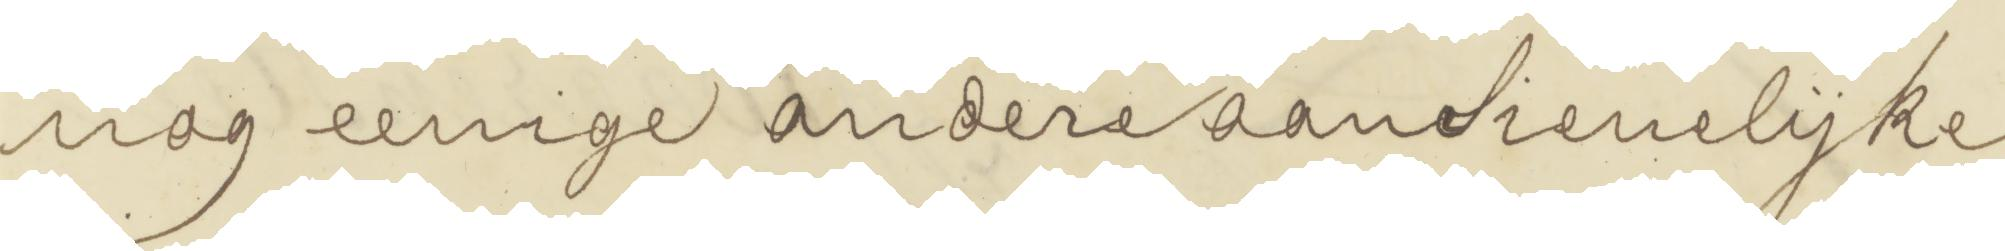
nog eenige andere aansienelijke
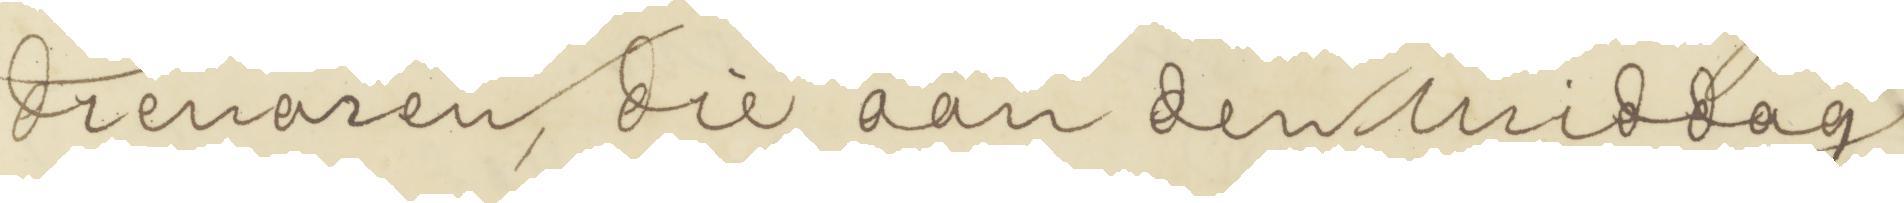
dienaren, die aan den middag
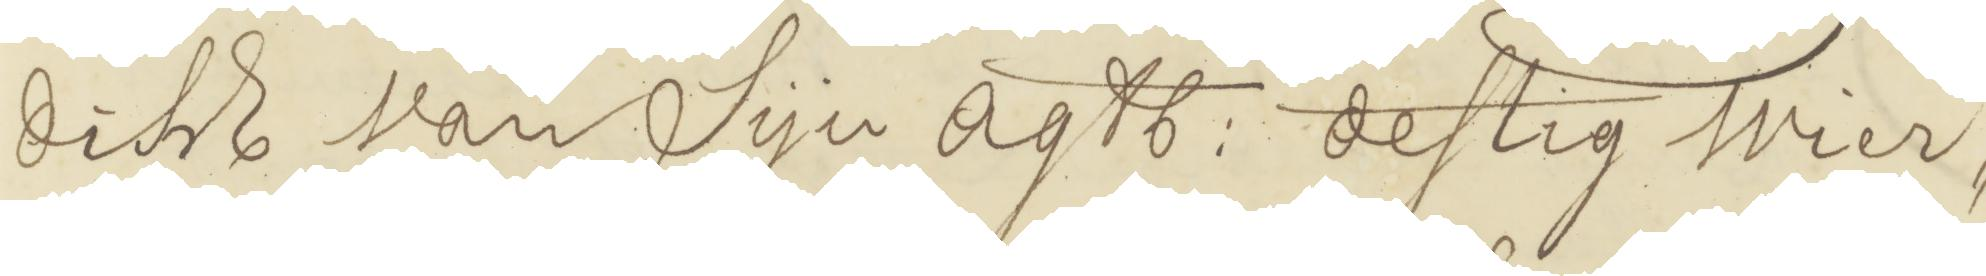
disch van Sijn agtb: deftig wier„
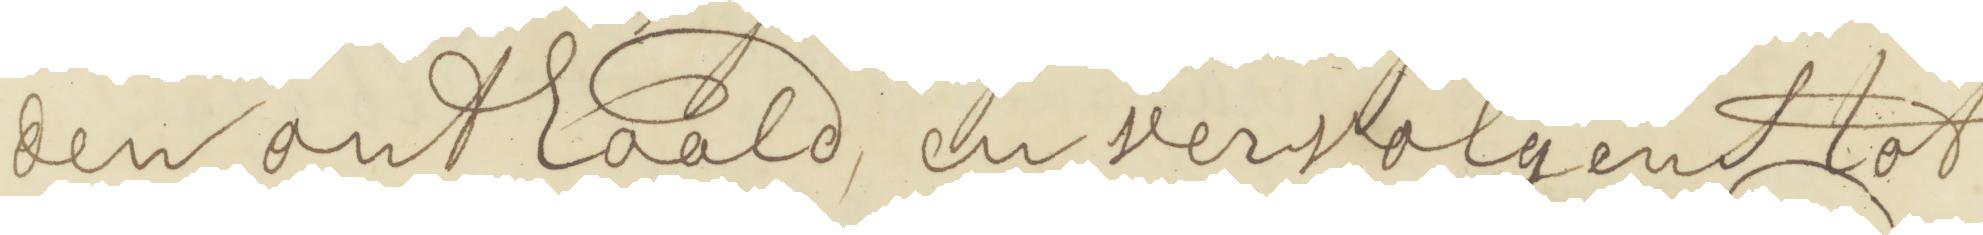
den onthaald, en vervolgens tot
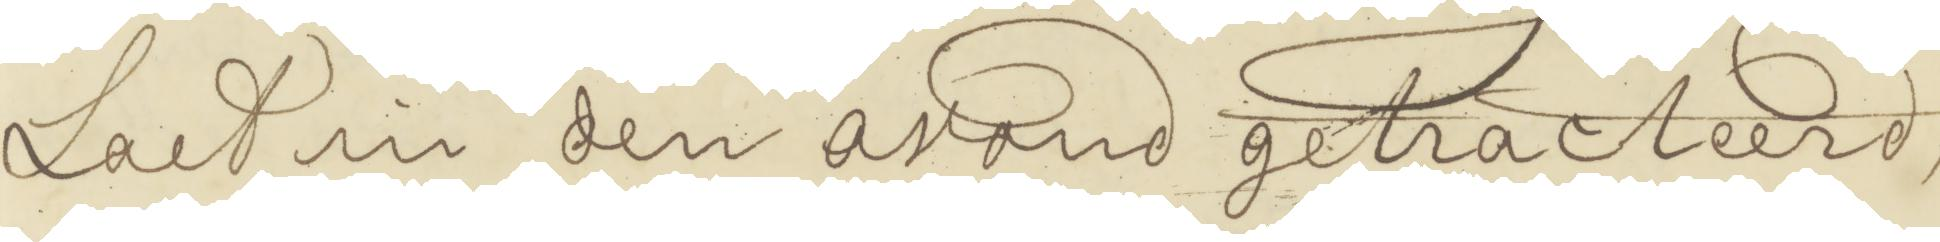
Laet in den avond getracteerd
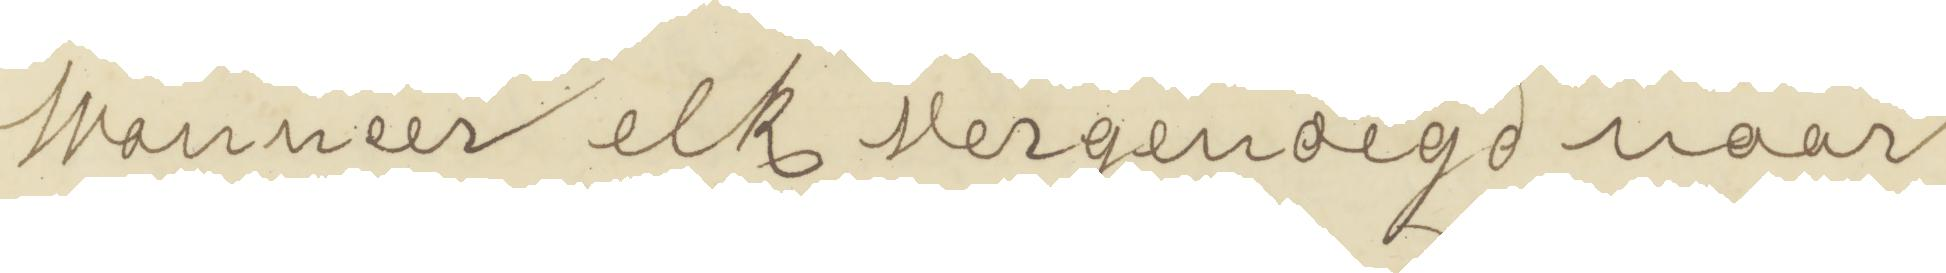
wanneer elk vergenoegd naar
